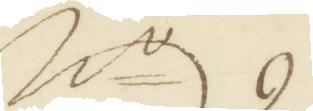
N=o 9
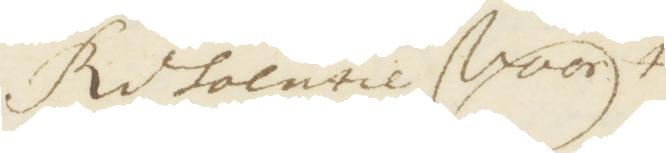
Resolutie voor 't
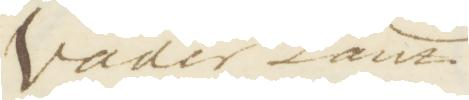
Vader Lant.
